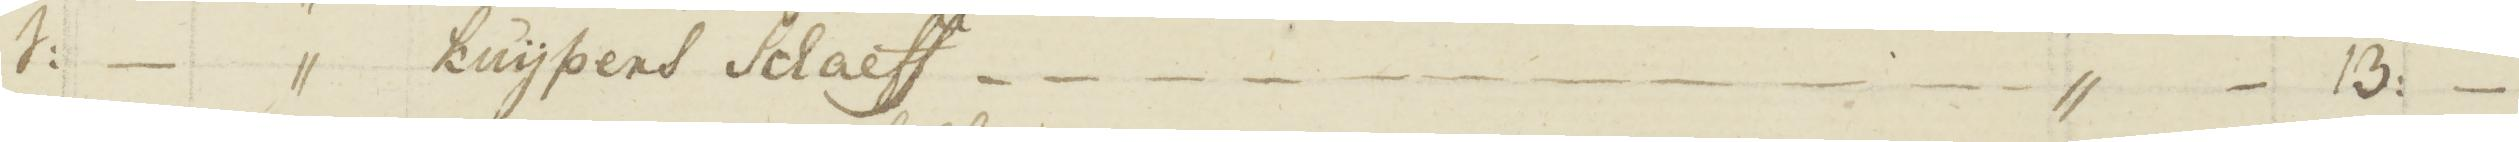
1: — „ kuijpers schaeff - - - - - - - - - - - „ — 13: —
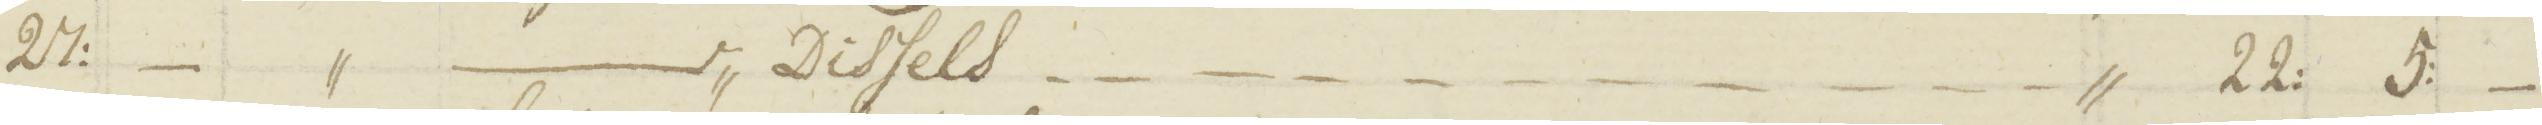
27: — „ _„o Dissels - - - - - - - - - - - „ 22. 5: —
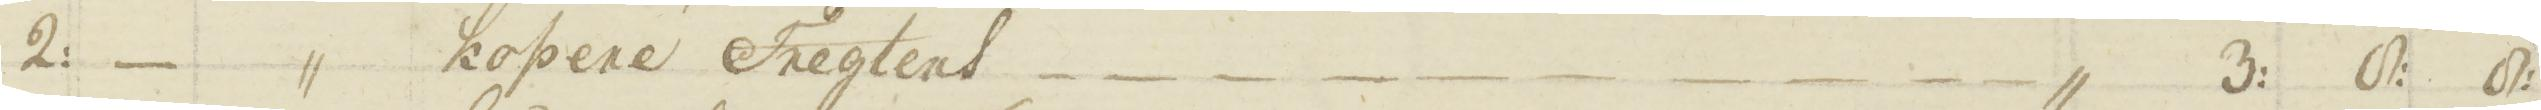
2: — „ kopere Tregters - - - - - - - - - - „ 3: 8: 8:
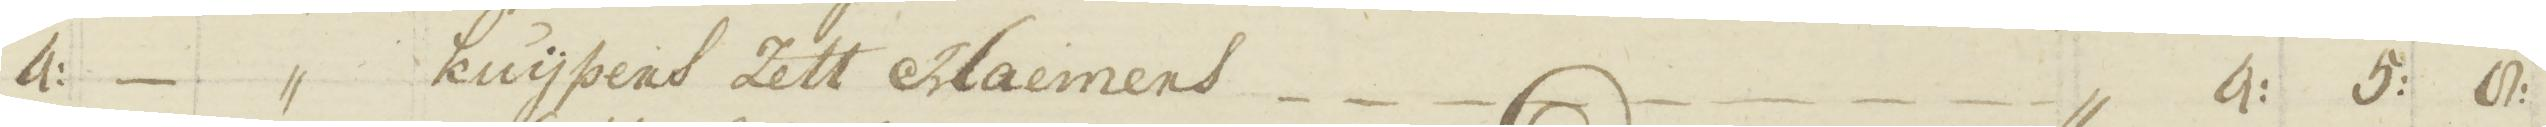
4: — „ kuijpers zett Haemers - - - - - - - - „ 4: 5: 8:
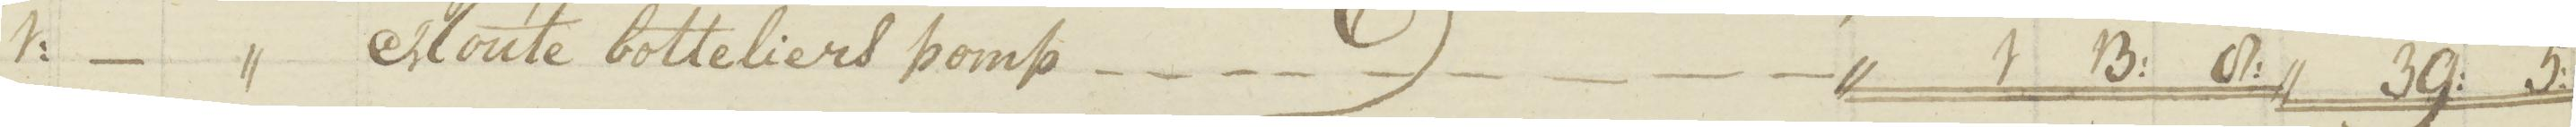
1: — „ Houte botteliers pomp - - - - - - - - - „ 1 13: 8: „ 39: 5:
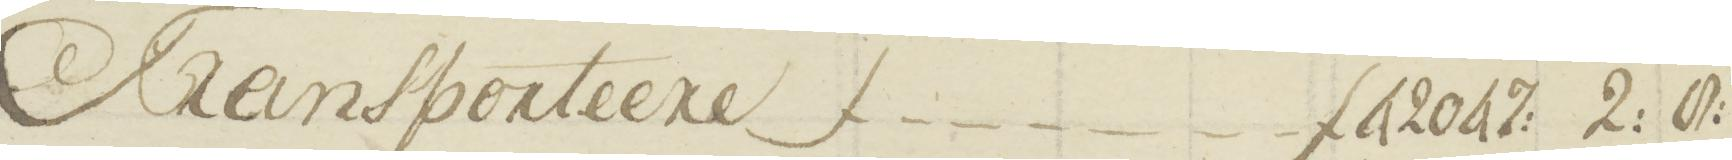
Transporteere ƒ - - - - - - ƒ 42047: 2: 8:
